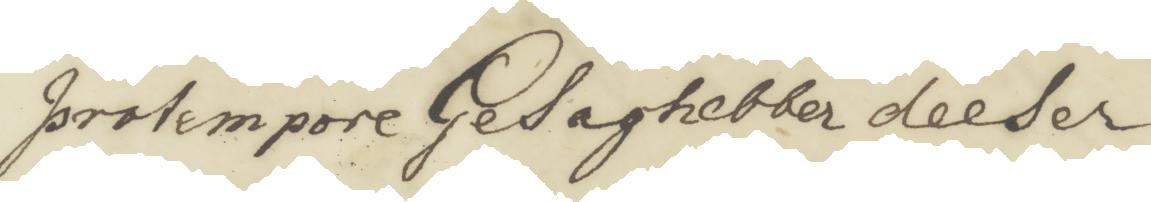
pro tempore Gesaghebber deeser
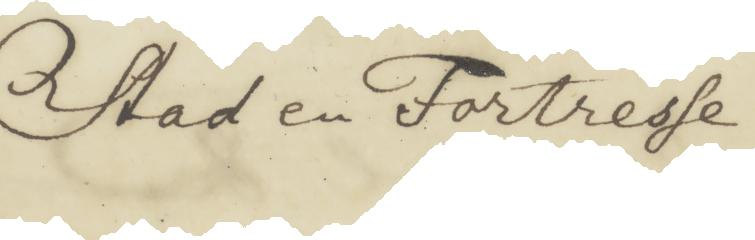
Stad en Fortresse
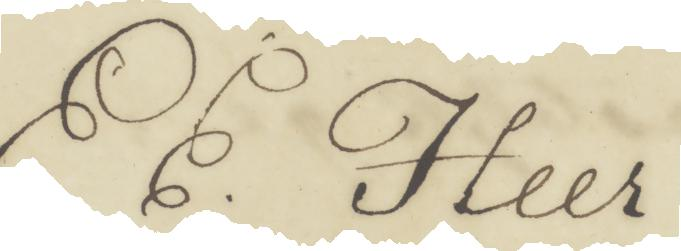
E E. Heer
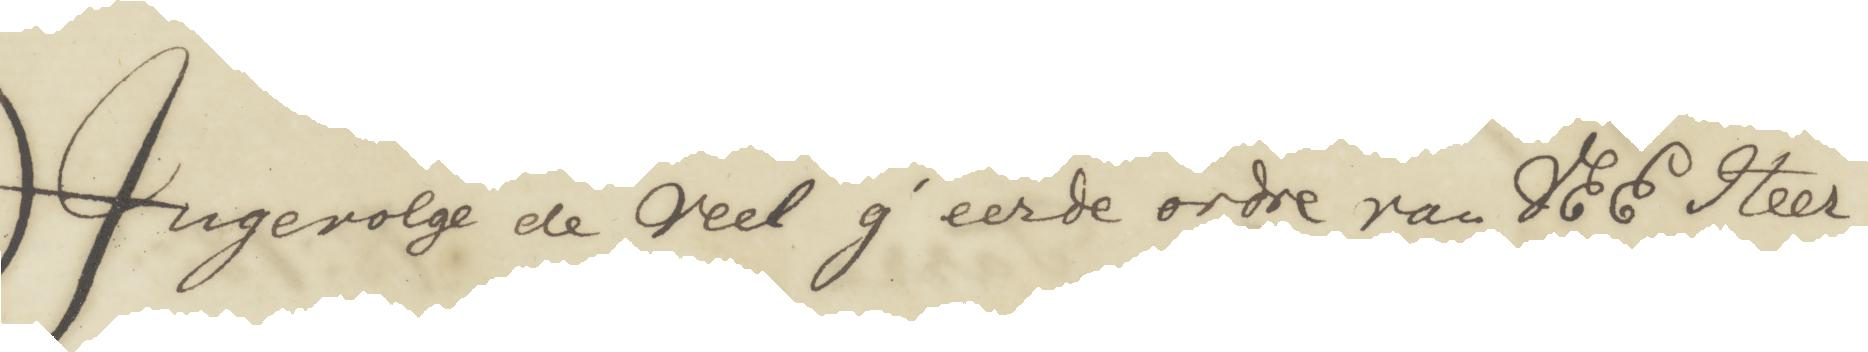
Jngevolge de veel g’eerde ordre van V E E Heer
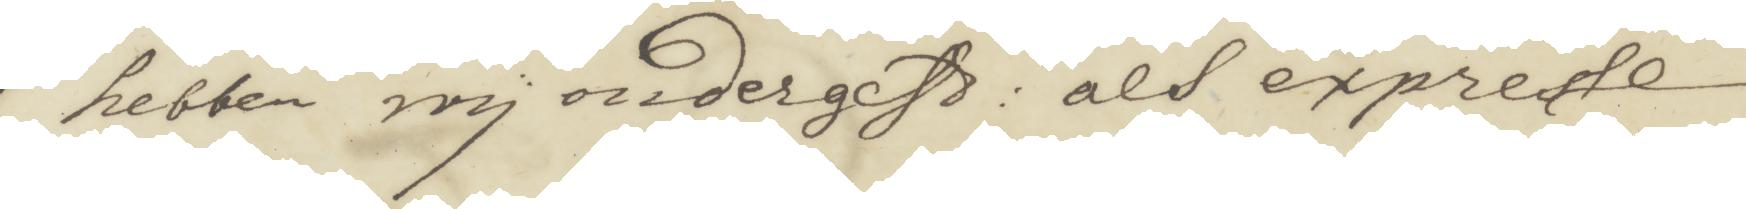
hebben wij ondergesd: als erpresse
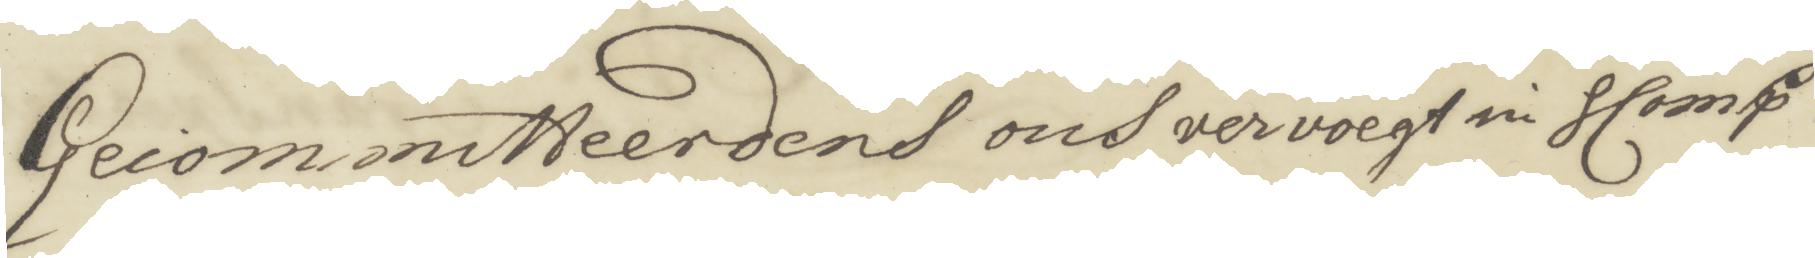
Gecommitteerdens ons vervoegt in s Comps
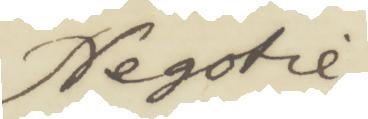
Negotie
